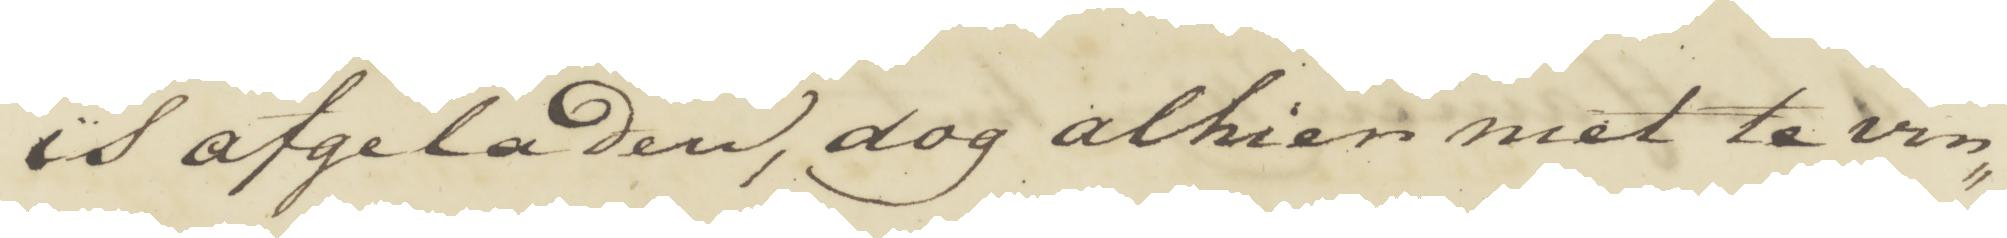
is afgeladen, dog alhier niet te vin„
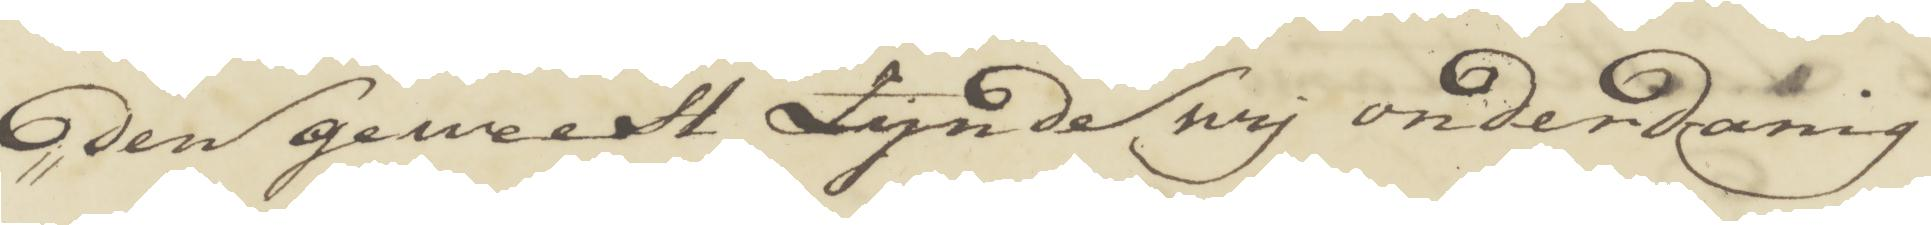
„den geweest zijnde wij onderdanig
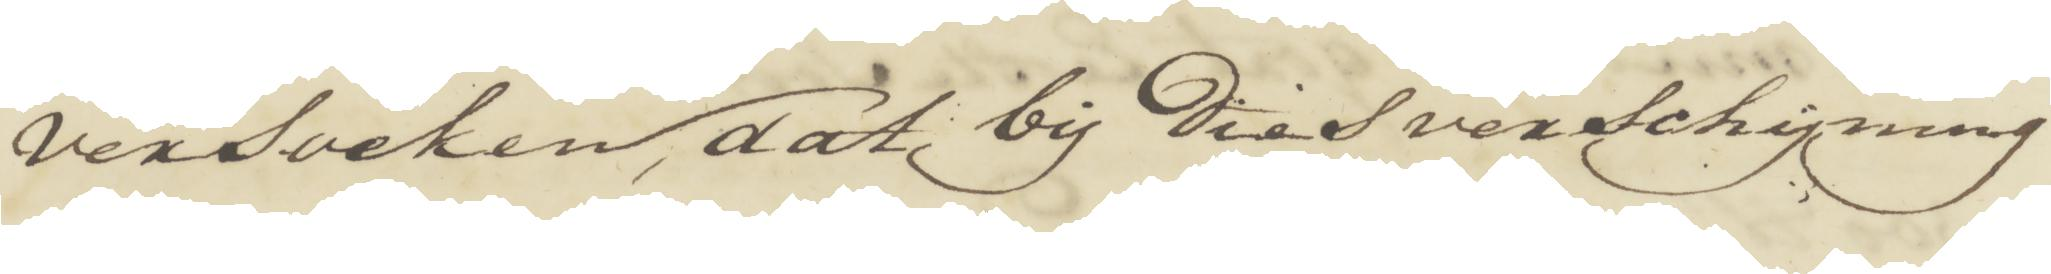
versoeken, dat bij dies verschijning
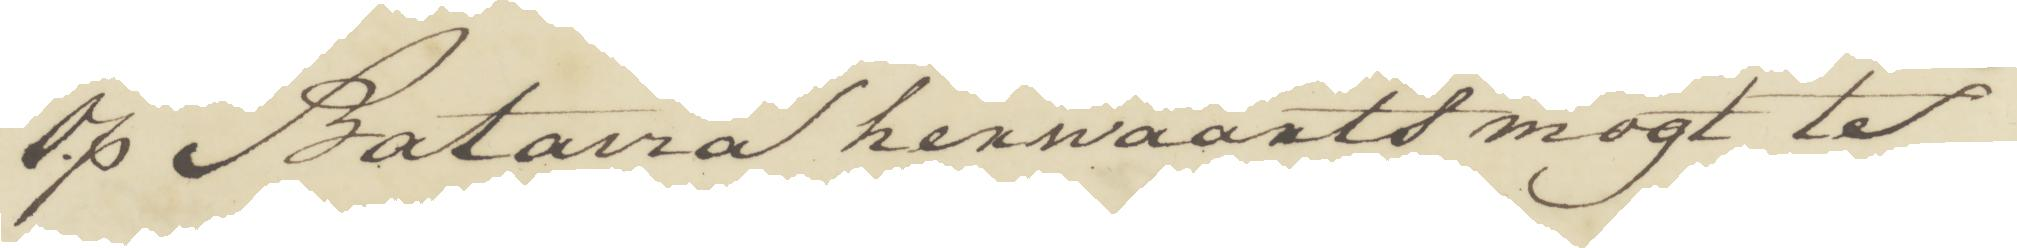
op Batavia herwaarts mogt te
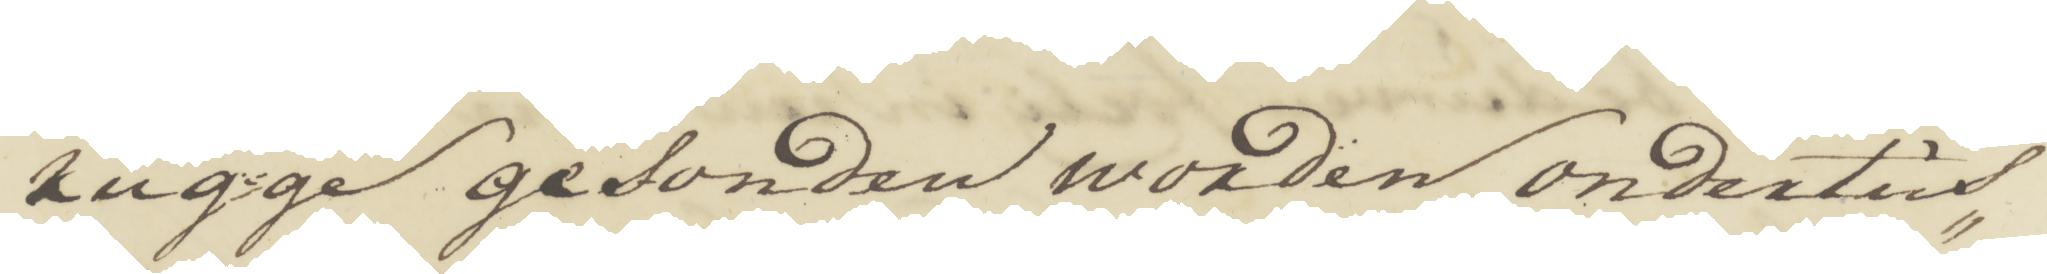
rugge gesonden worden ondertus„
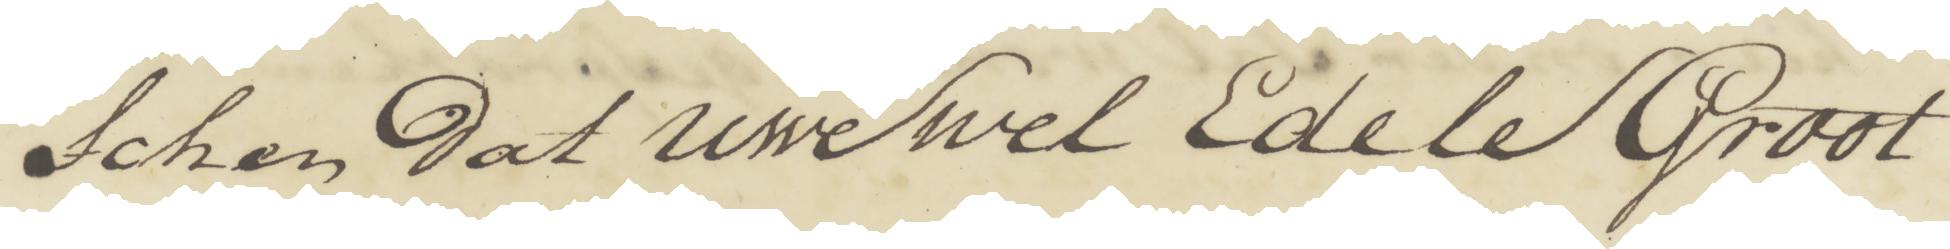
schen dat uwe wel Edele Groot
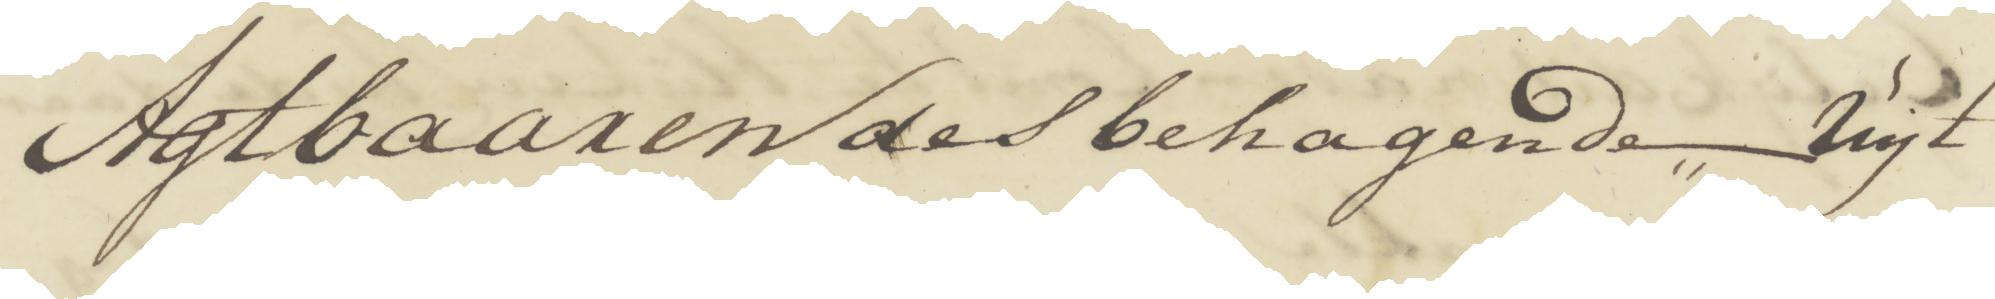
Agtbaaren des behagende„ uijt
